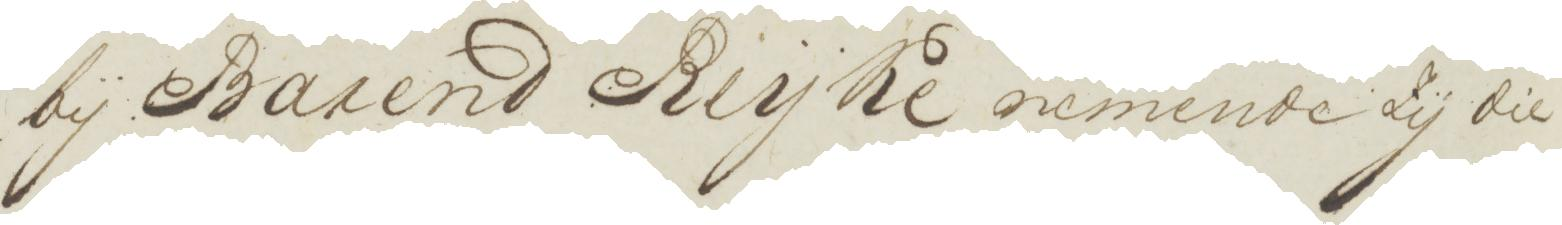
bij Barend Reijke nemende zij die
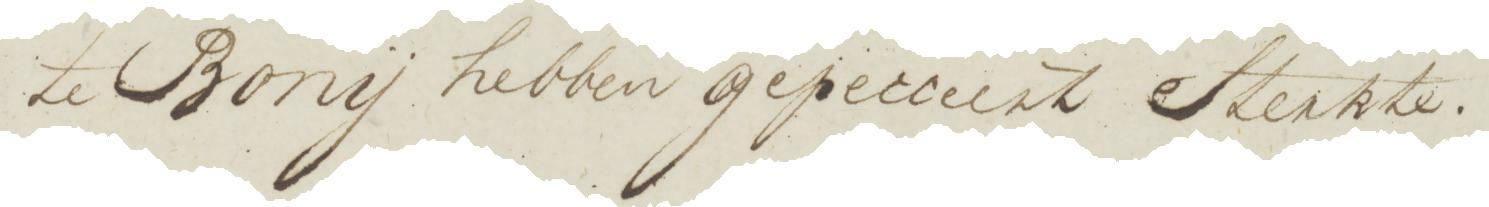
te Bonij hebben gepecceert sterkte.
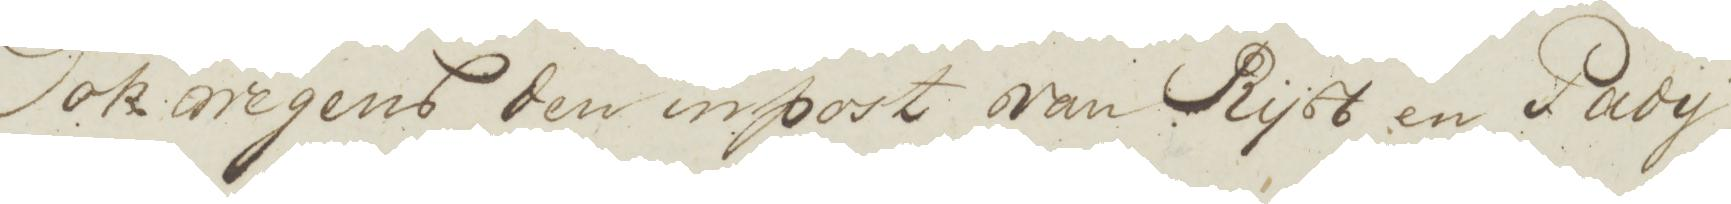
Ook wegens den inpost van Rijst en Padij
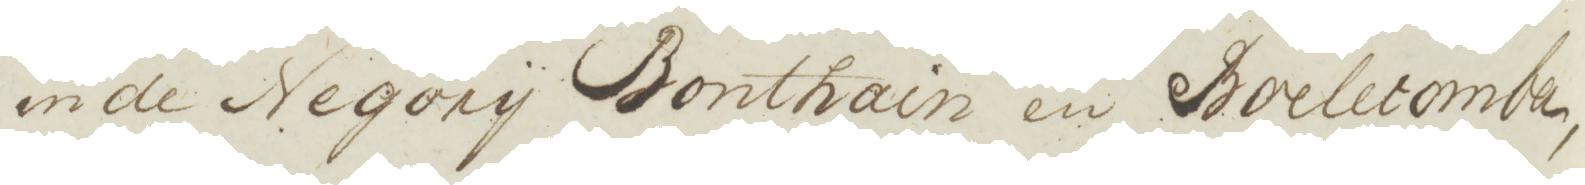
in de Negorij Bonthain en Boelecomba,
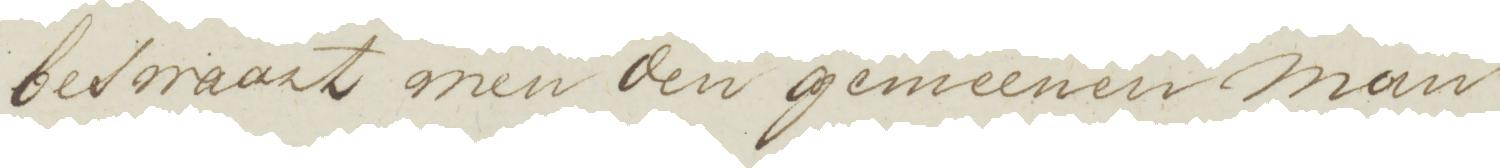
beswaart men den gemeenen man
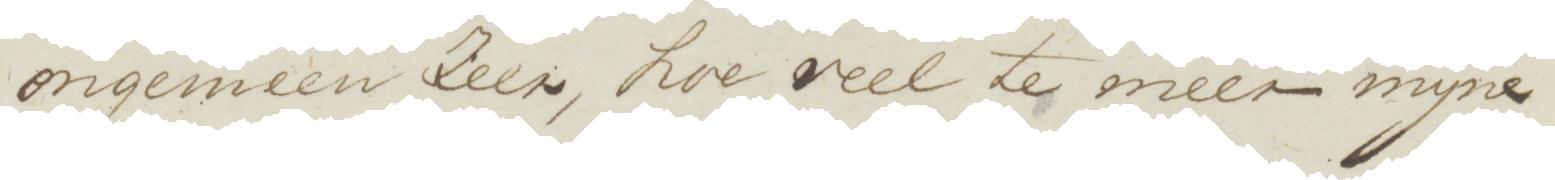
ongemeen zeer, hoe veel te meer mijne
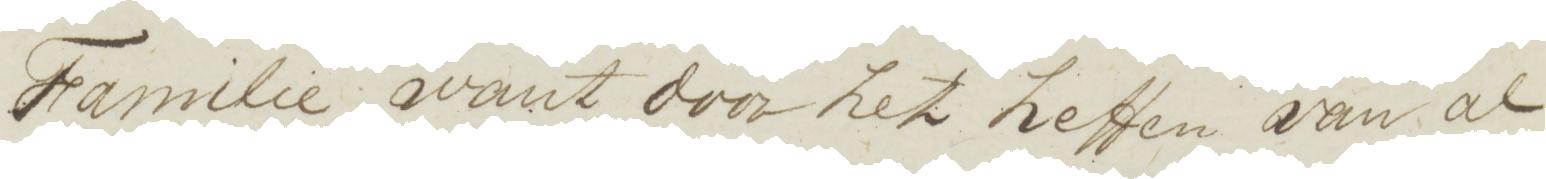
Familie, want door het heffen van al
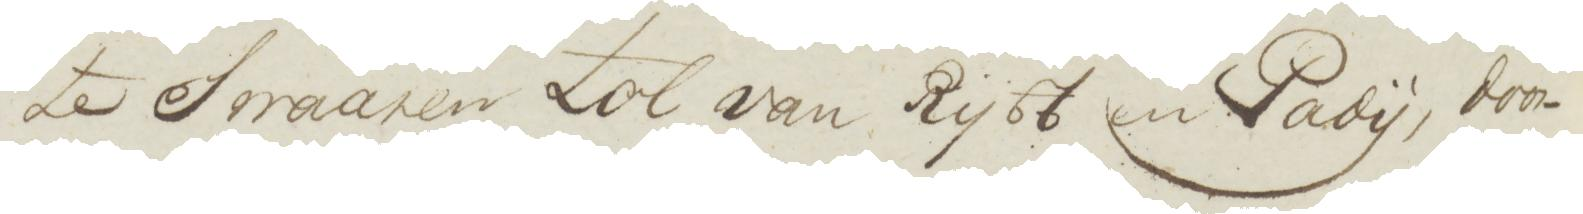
te swaaren tol van Rijst en Padij, door
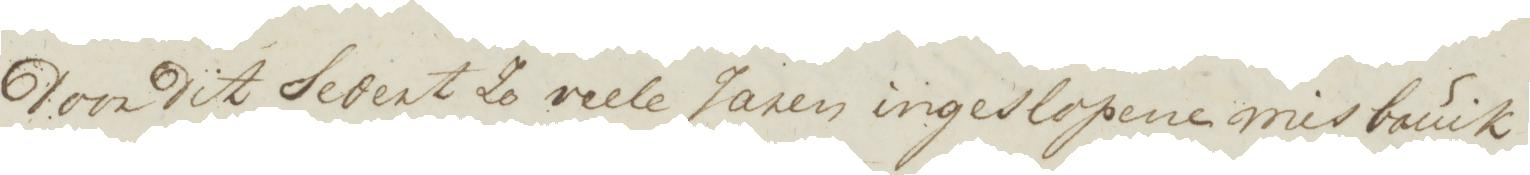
door dit sedert zo veele Jaren ingeslopene misbruik
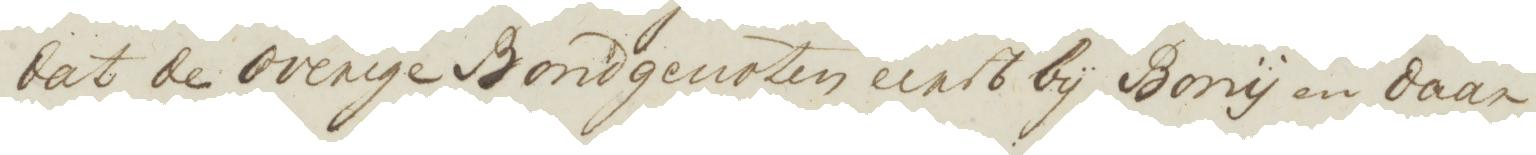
dat de overige Bondgenoten eerst bij Bonij en daar
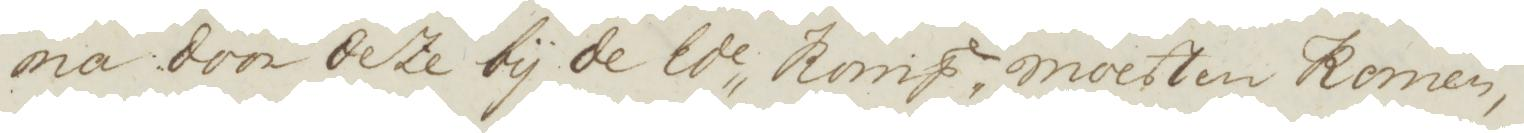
na :door deze bij de Ed„e Komp„e moesten komen,
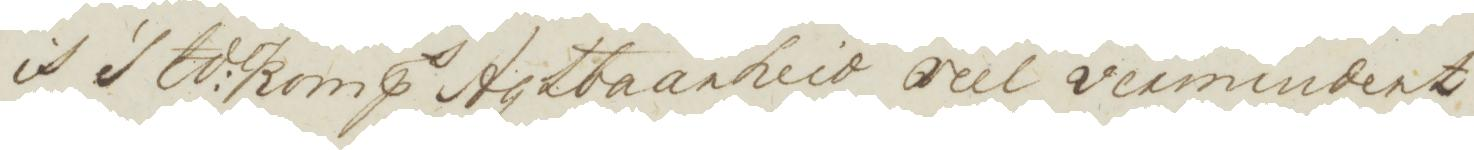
is ’s Ed: Komps Agtbaarheid veel vermindert
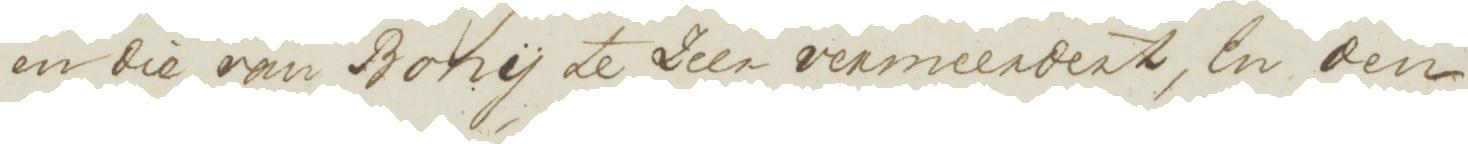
en die van Bonij te zeer vermeerdert, En den
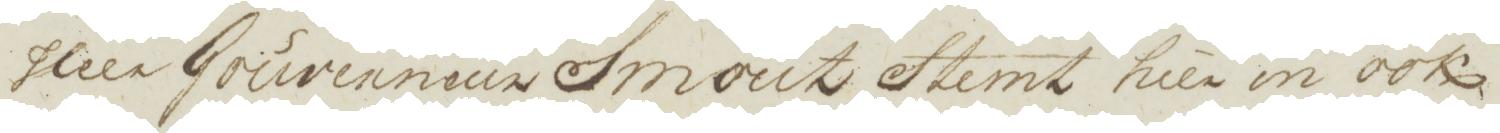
Heer Gouverneur Smout Stemt hier in ook
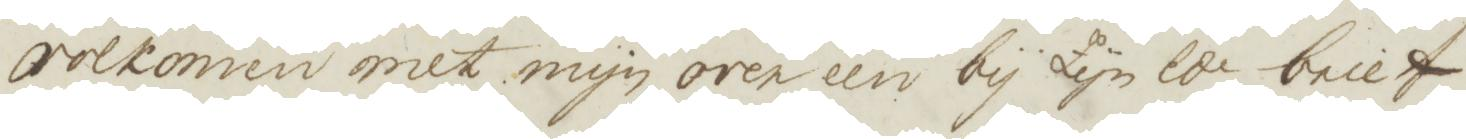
volkomen met mijn over een bij zijn Ed„e brief
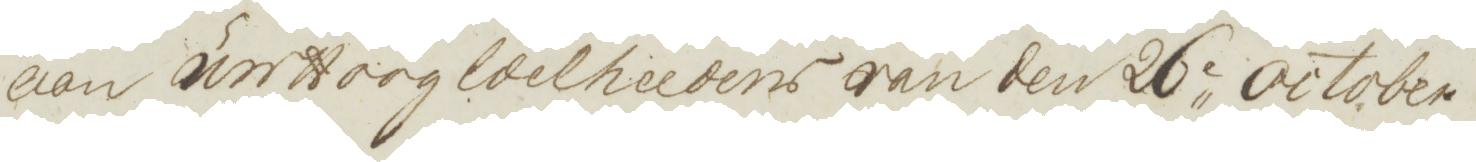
aan uw Hoog Edelheedens van den 26„e October
